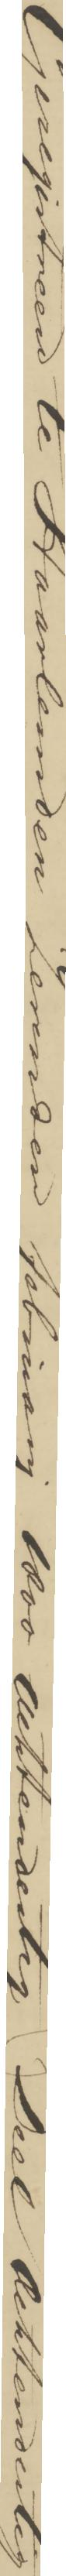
Geregistreerd te Haarlem den Zevenden februarij 1800 achtendertig. Deel achtendertig
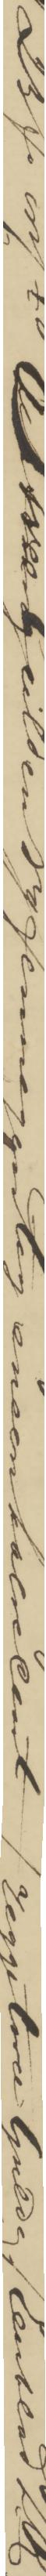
23to cnCt Twee Gulden vijfennegentig en een halve Cent / zegge twee Gulden / Eencend ZR
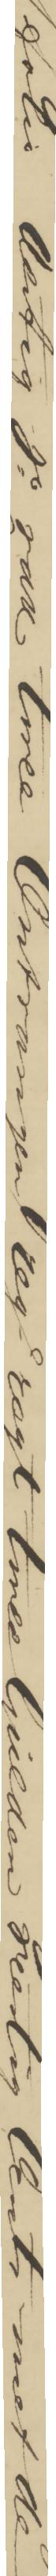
folio dertig V=o vak twee Ontvangen reg-e regt twee Gulden veertig Cents met de
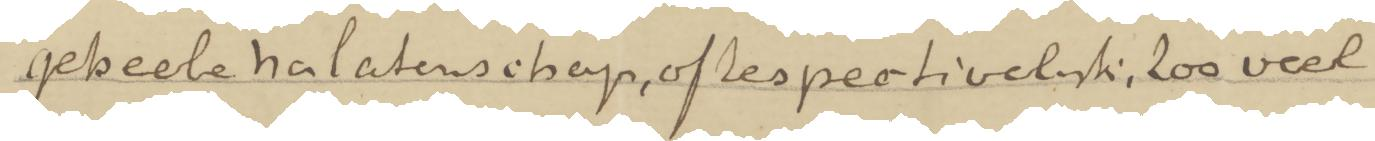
geheele nalatenschap, of respectivelyk, zoo veel
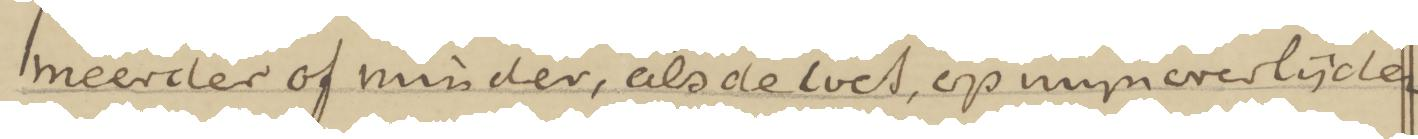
meerder of minder, als de wet, op myn overlijden
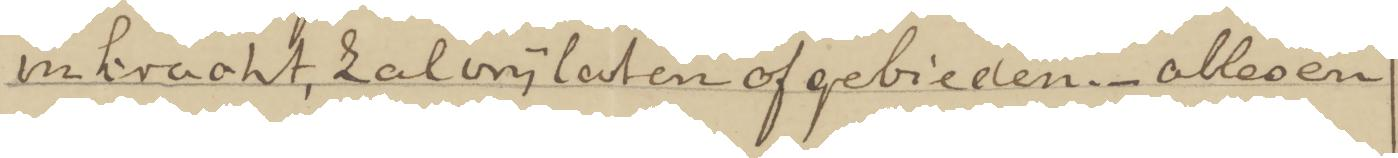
in kracht, zal vrij laten of gebieden. – alles en
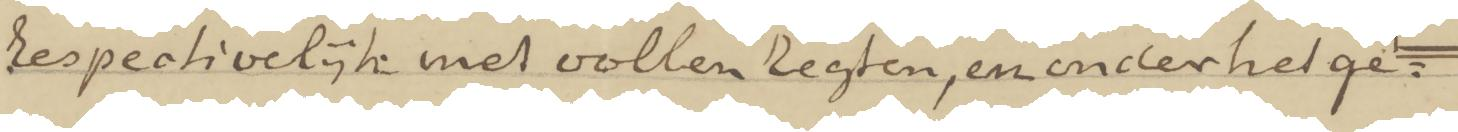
respectivelijk met vollen regten, en onder het ge=
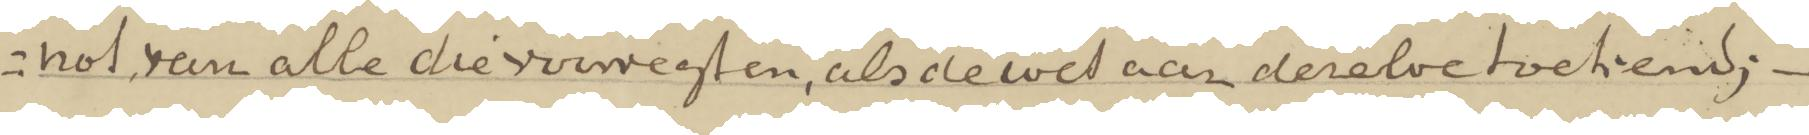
=not van alle die voorreggten, als de wet aan dezelve toekend;
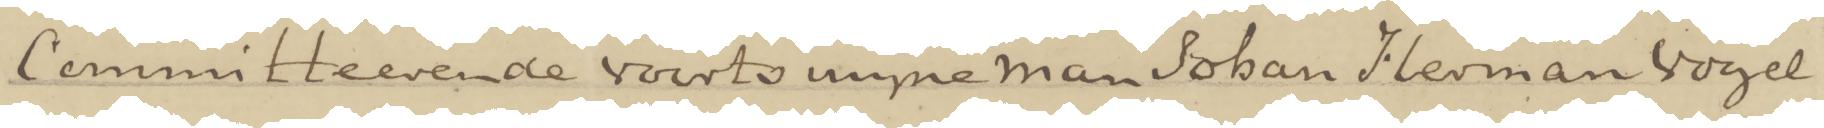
Committeerende voorts myne man Iohan Herman Vogel
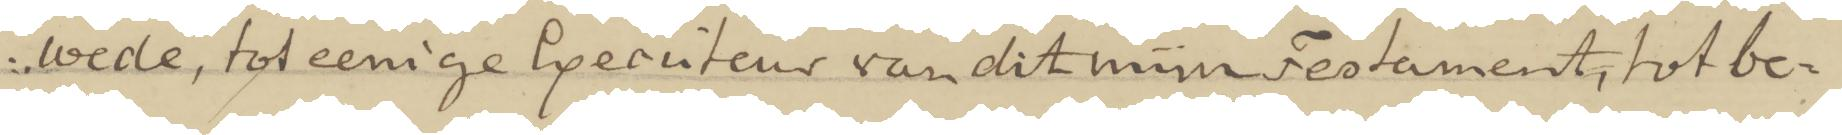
=.wede, tot eenige Executeur van dit mijn Testament, tot be=
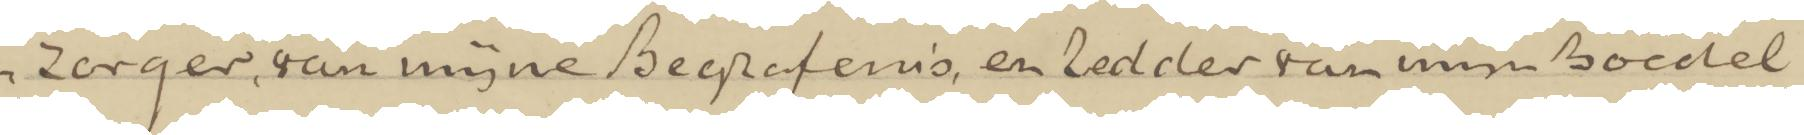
=zorger van mijne Begrafenis, en redder van myn Boedel
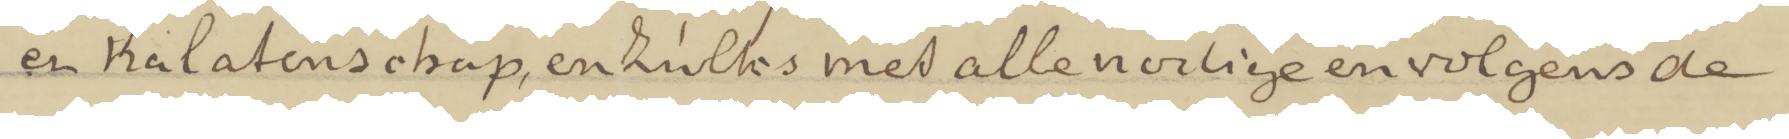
en Nalatenschap, en zulks met alle nodige en volgens de
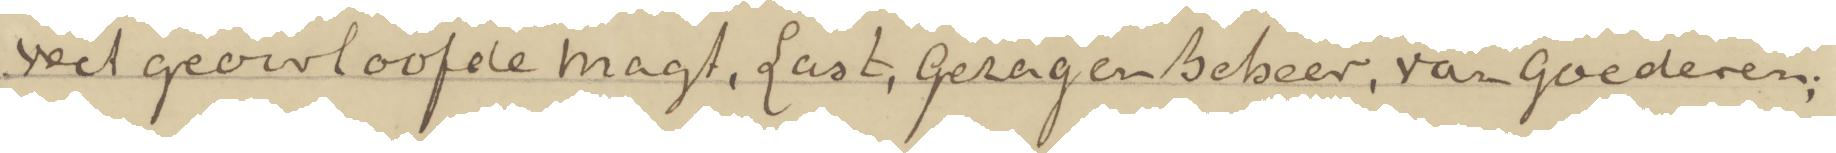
wet geoorloofde magt, Last, gezag en Beheer, van goederen;
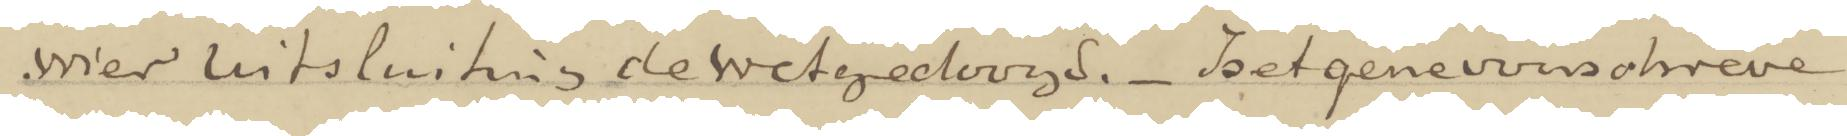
wier uitsluiting de wet gedoogd. – het gene voorschreve
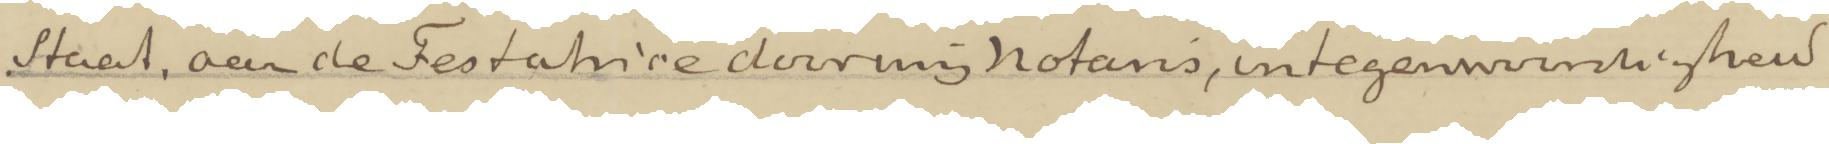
staat, aan de Testatrice door mij Notaris, in tegenwoordigheid
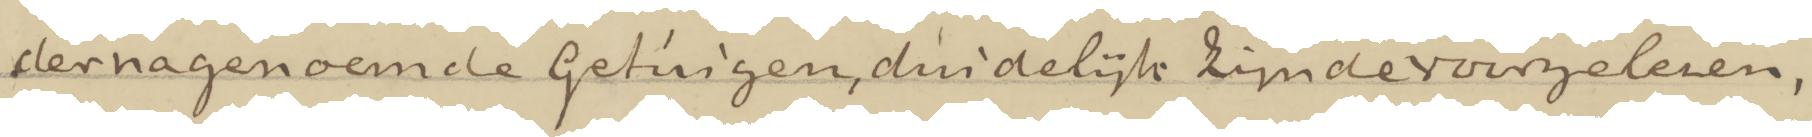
=der nagenoemde Getuigen, duidelijk zijnde voorgelezen,
